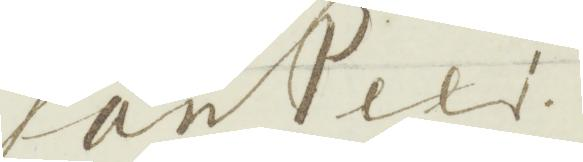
Van Peer.
